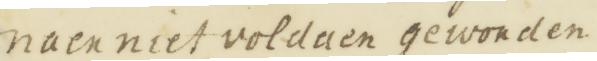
naer niet voldaen geworden
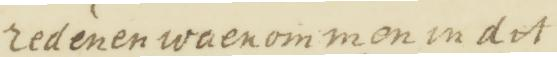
redenen waerom men in dit
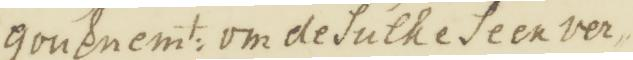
gouvernem:t om de sulke seer ver„
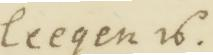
leegen is.
